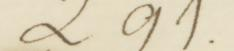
291.
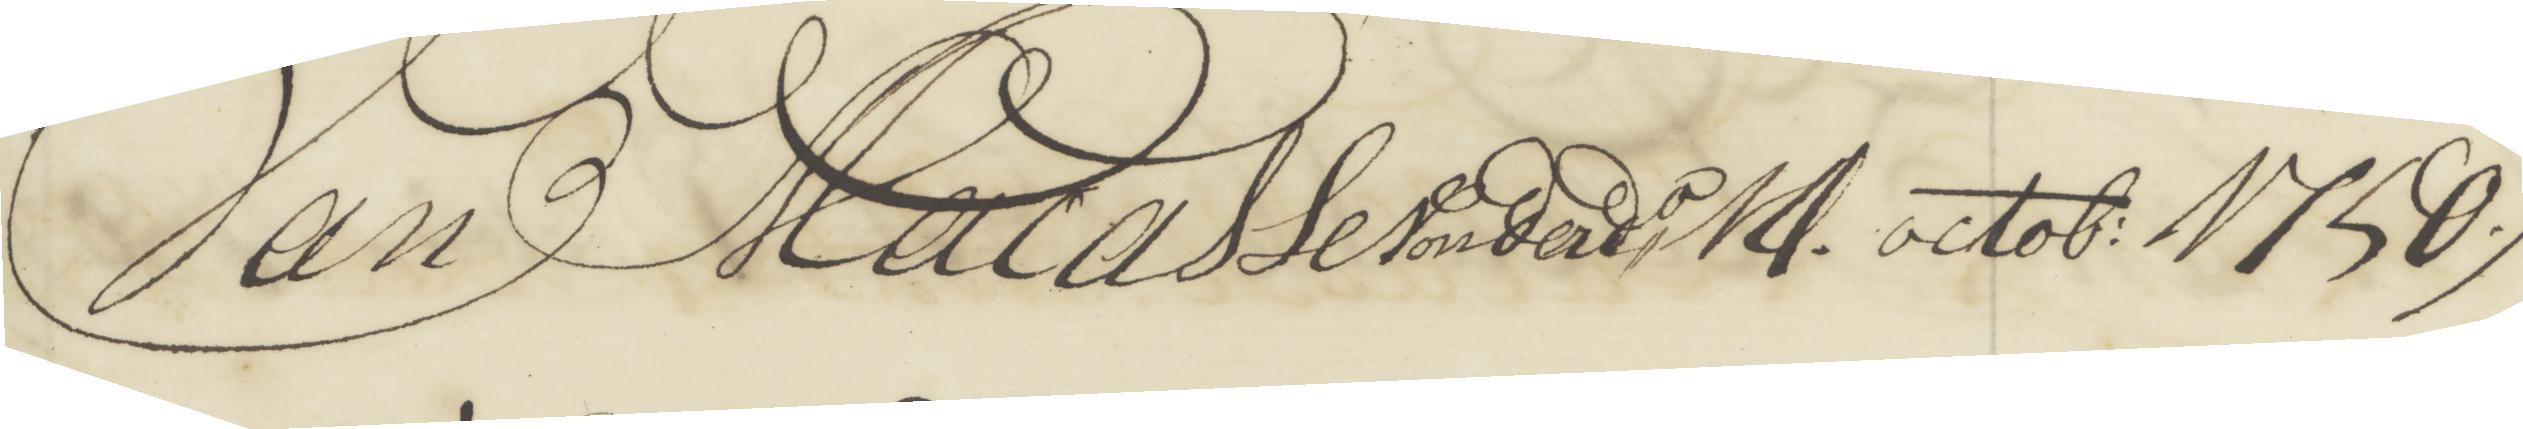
Van Macasser onder d„o 14. octob: 1750./
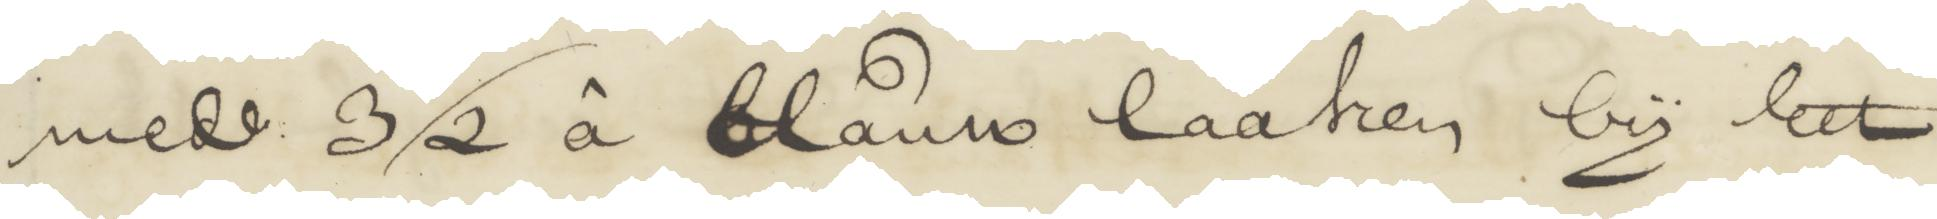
mede: 3½ â blauw laaken bij het
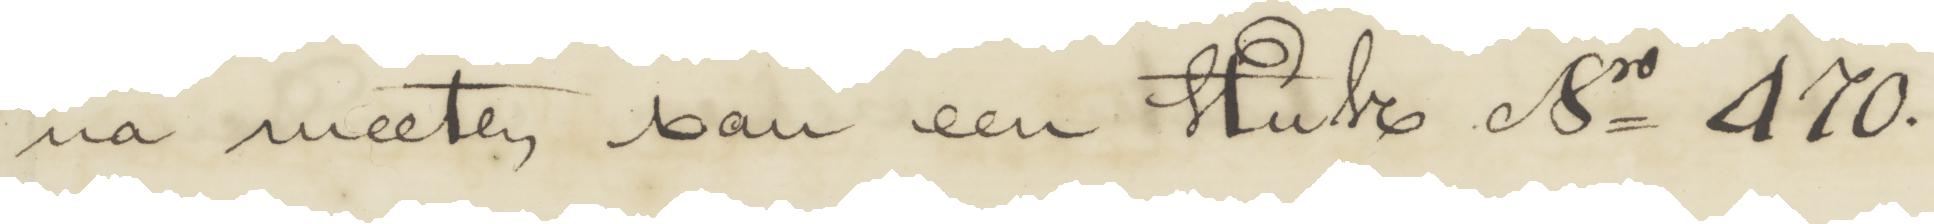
na meeten van een stuk N=ro 470.
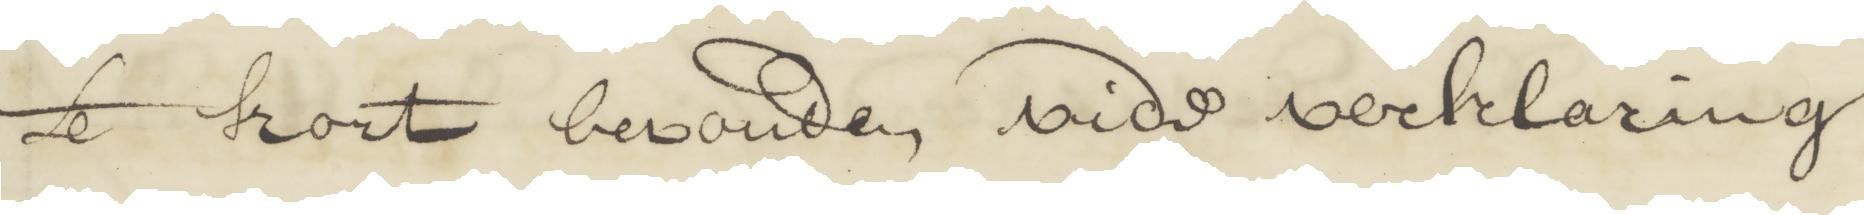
te kort bevonden vide verklaring
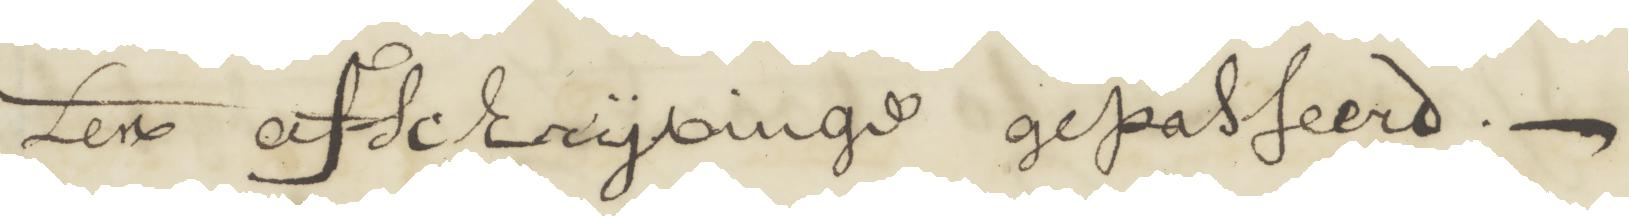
ter afschrijvinge gepasseerd.—
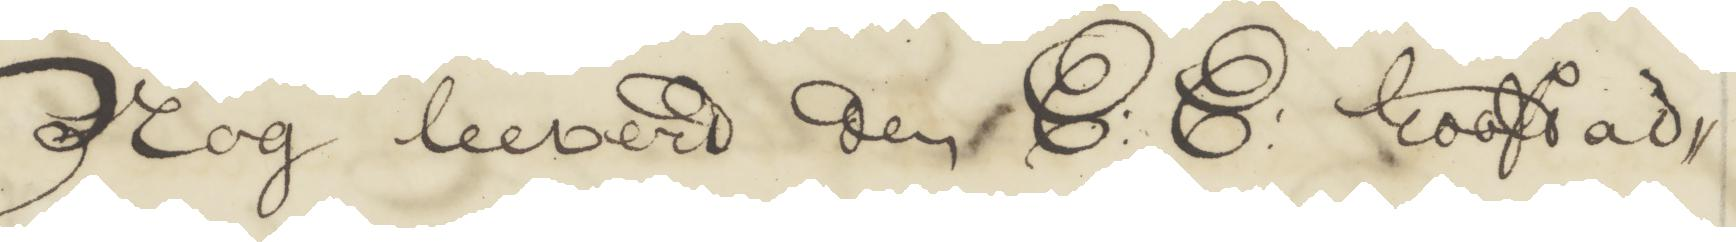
Nog leeverd den E: E: hooft ad„
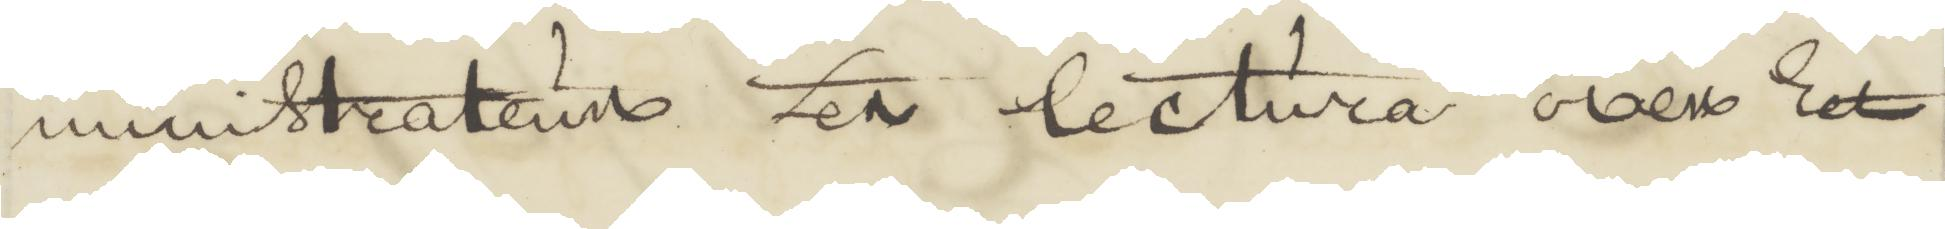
ministrateur ter lectura over het
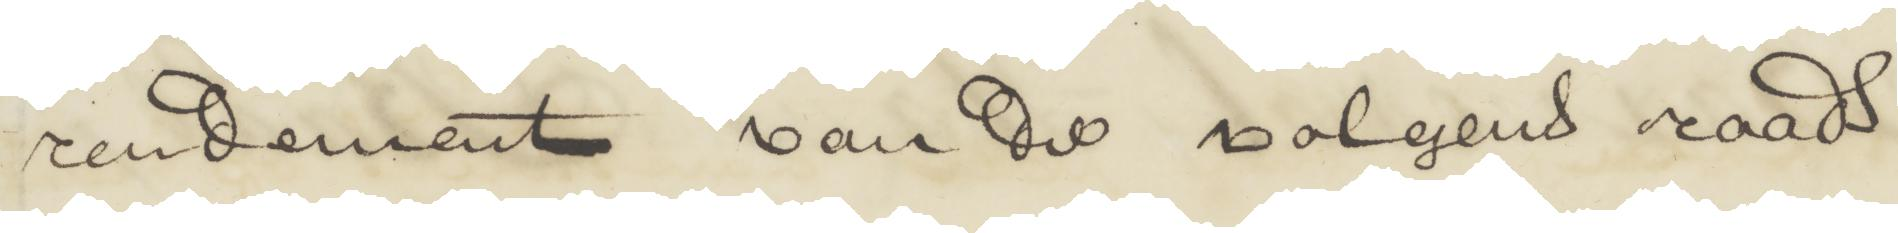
rendement van de volgens raads
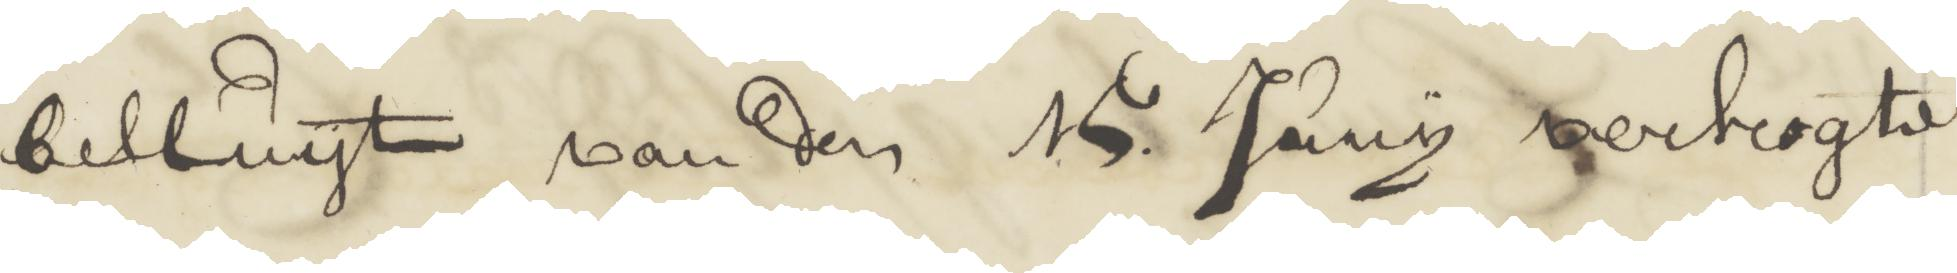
besluijt van den 15. Junij verkogte
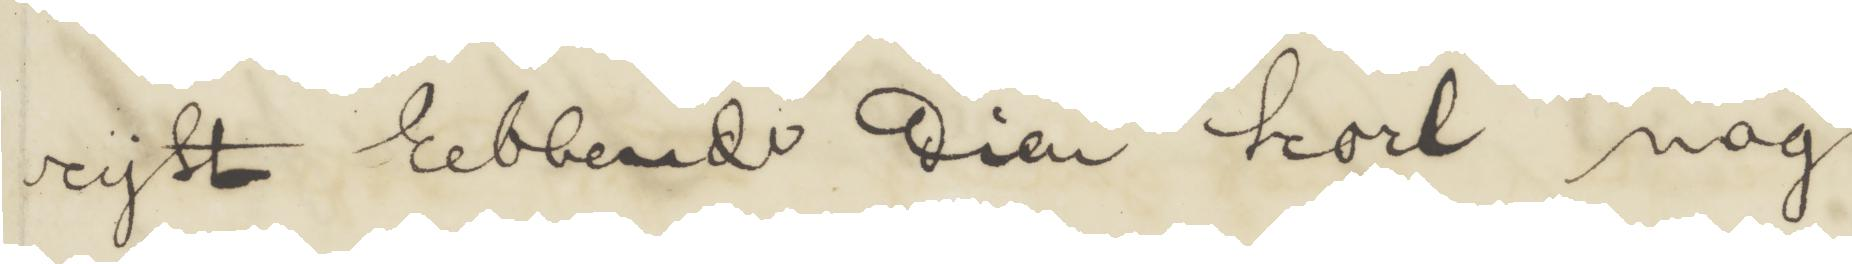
rijst hebbende dien korl nog
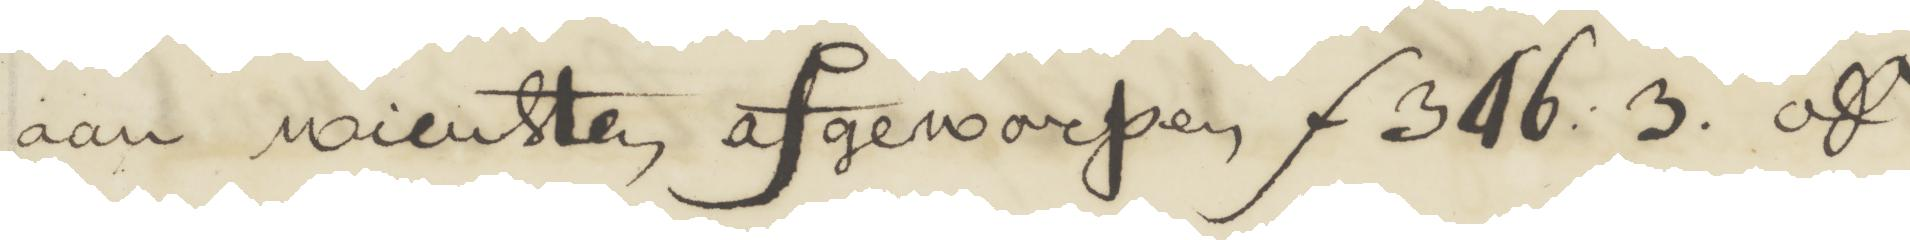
aan wiensten afgeworpen ƒ 346:3. of
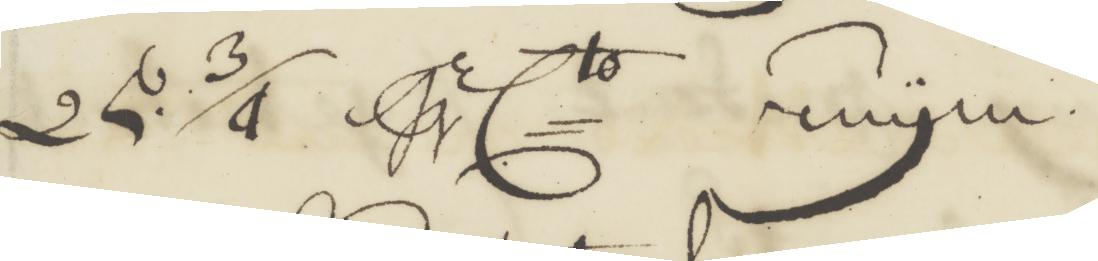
25.¾ p„rC=to ruijm.
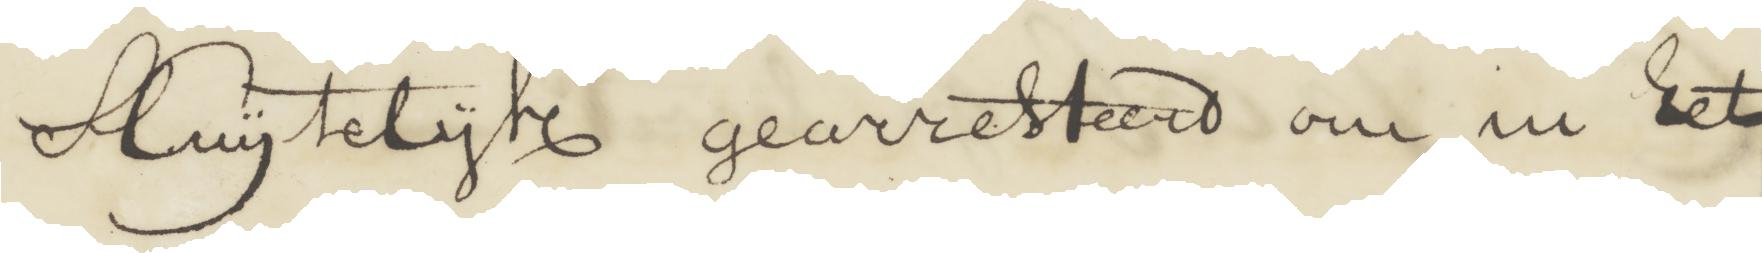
Sluijtelijk gearresteerd om in het
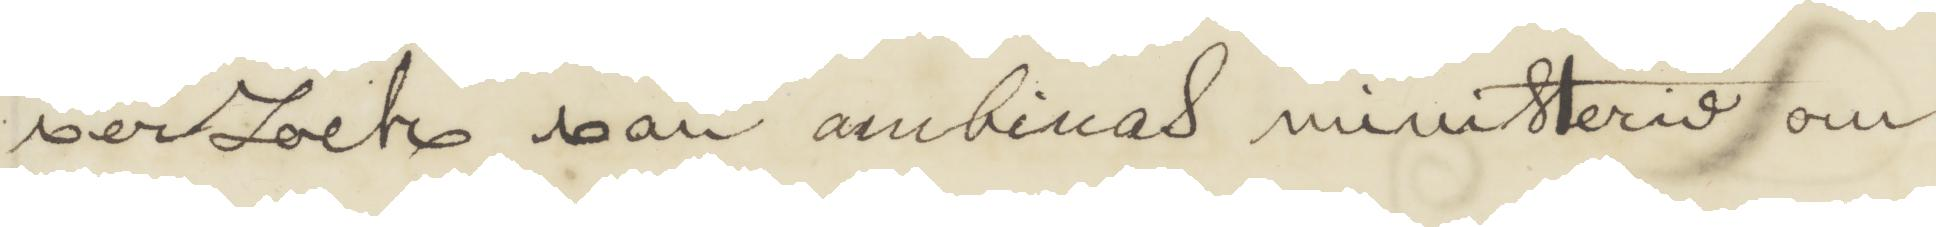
verzoek van ambinas ministerie om
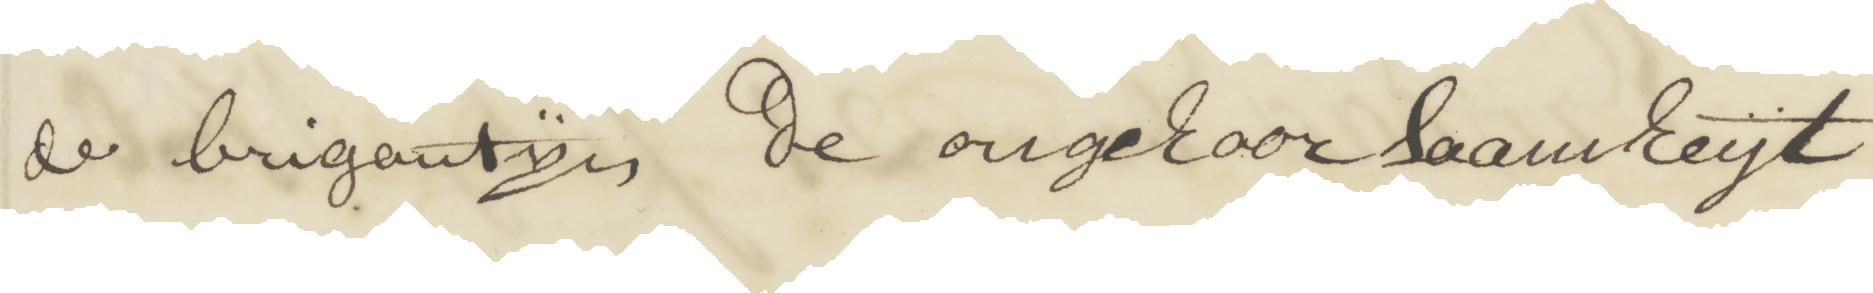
de brigantijn de ongehoorsaamheijt
